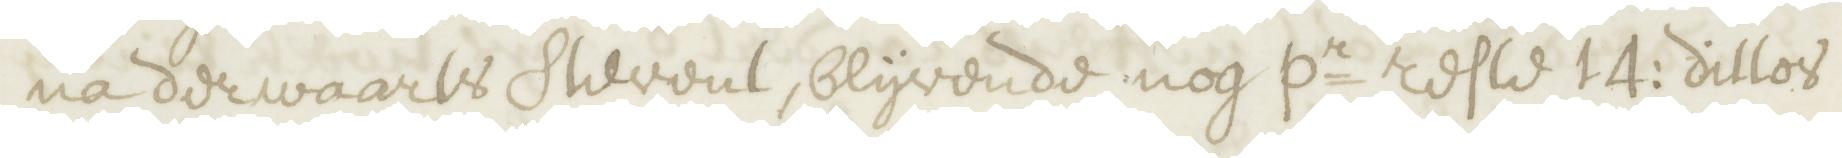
na derwaarts stevent, blijvende nog p=r reste 14: dittos
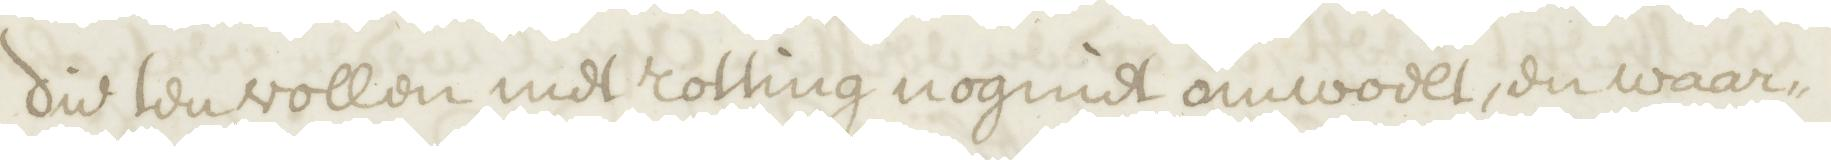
die ten vollen met rotting nogniet omwoelt, en waar„
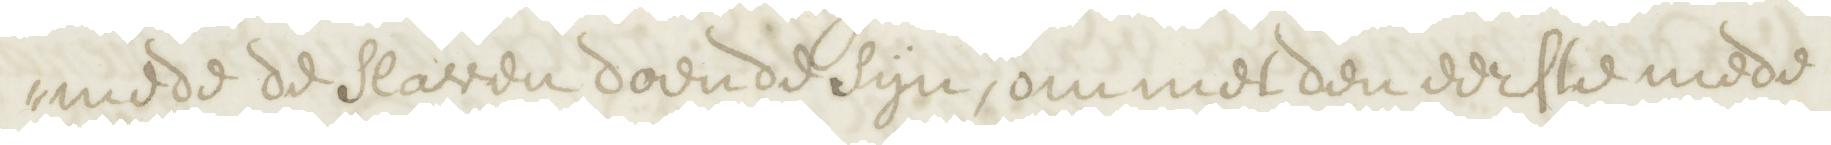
mede de slaven doende sijn, om met den eerste mede
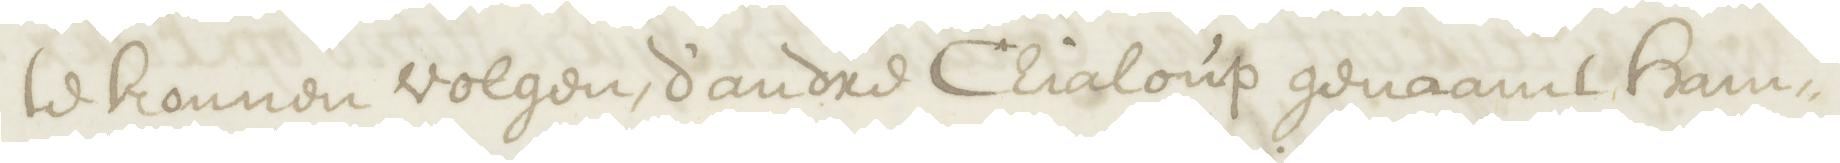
te konnen volgen, d'andre Chialoup genaamt ham„
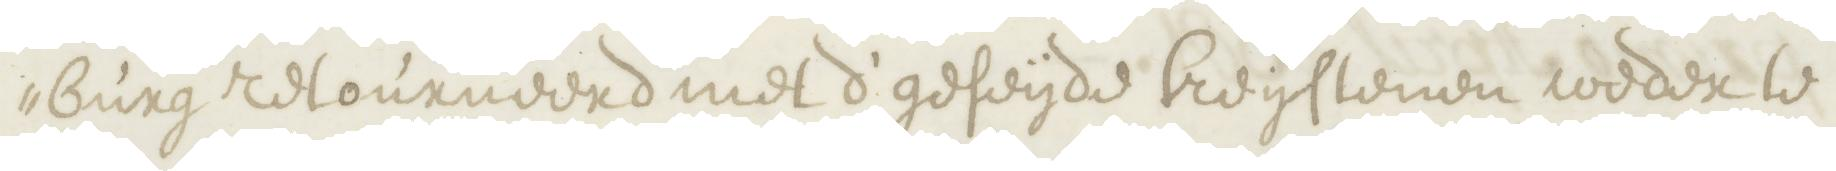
„burg retourneerd met d’ geseijde keijstenen weder te
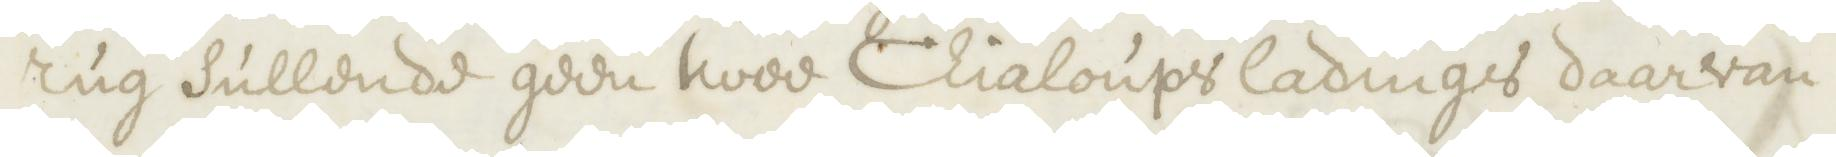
rug sullende geen twee Chialoups ladings daar van
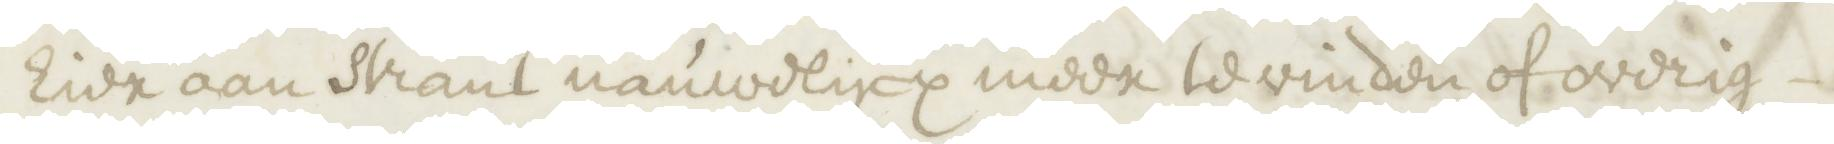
hier aan strant nauwelijcx meer te vinden of overig —
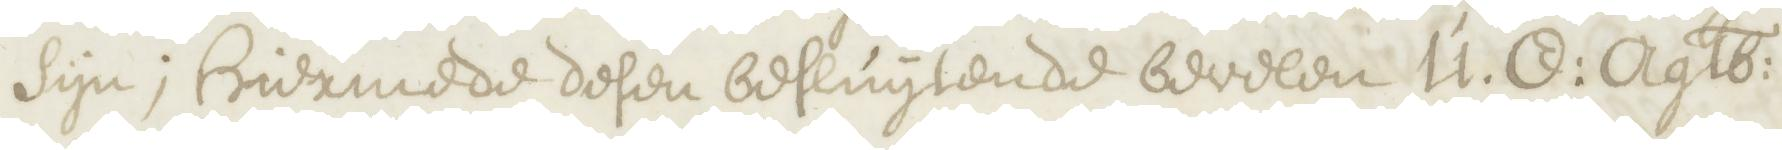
sijn; hiermede desen besluijtende bevelen U.E: Agtb:
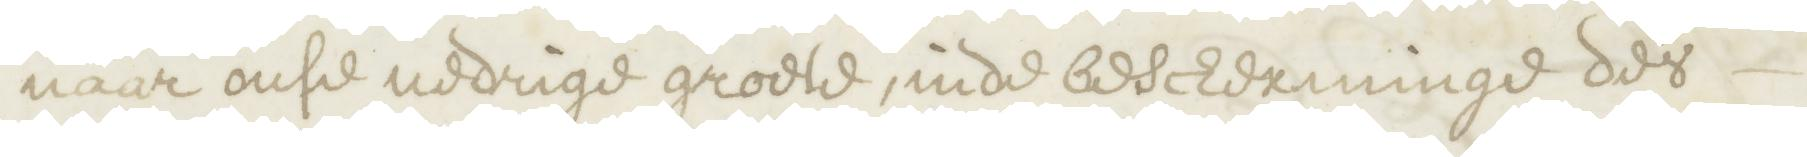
naar onse nedrige groete, in de bescherminge des —
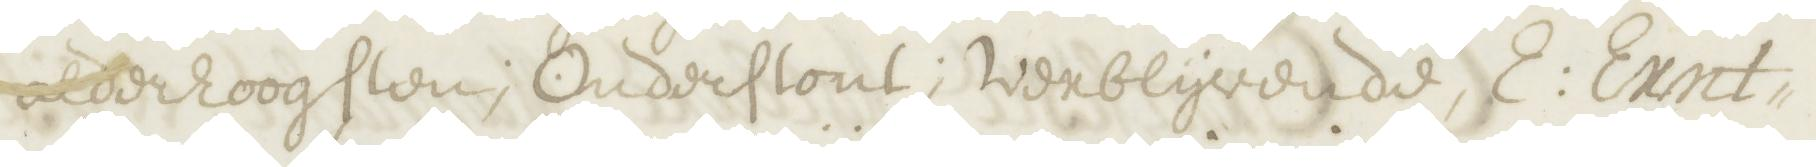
alderhoogsten; Onderstont; verblijvende, E: Ernt„
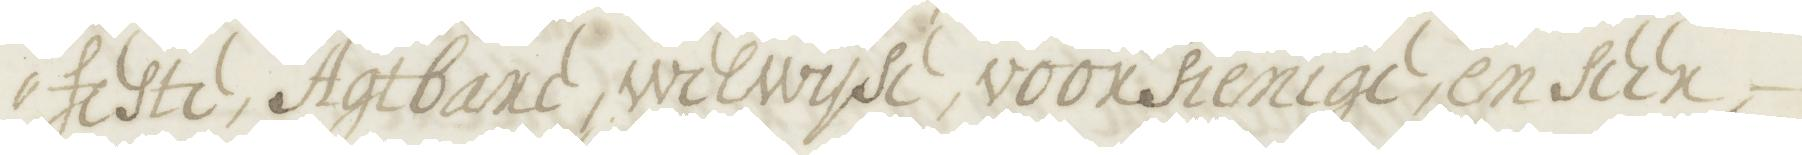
„feste, Agtbare, welwijse, voorsienige, en seer —
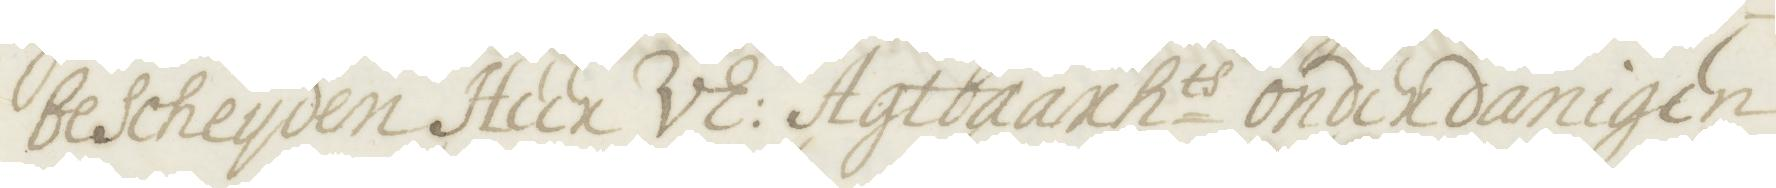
bescheijden Heer VE: Agtbaarh=ts onderdanigen
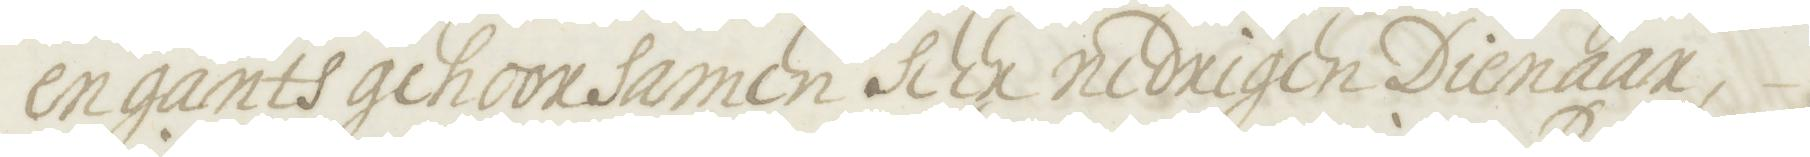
en gants gehoorsamen seer nedrigen Dienaar, —
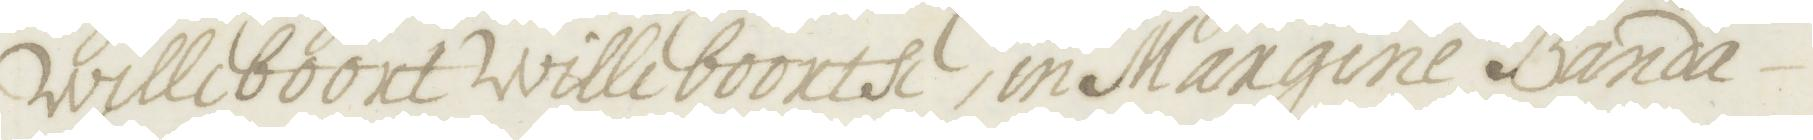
Willeboort Willeboortse, in Margine Banda —
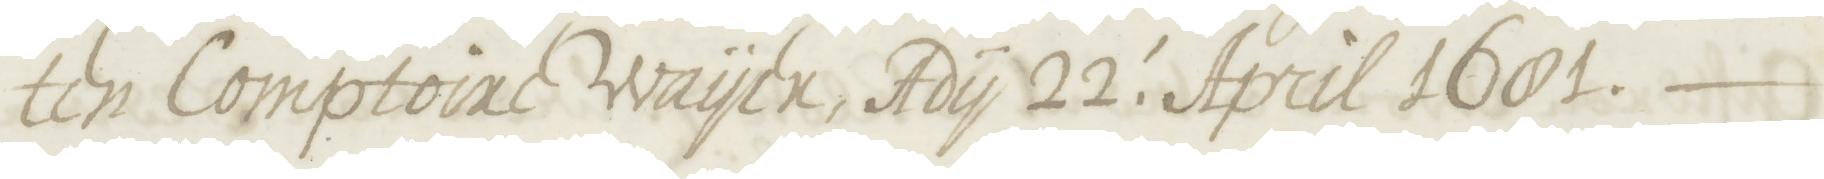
ten Comptoire waijer, Adij 22.' April 1681. —
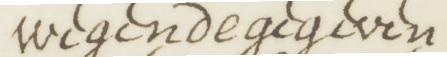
wegen de gegeven
